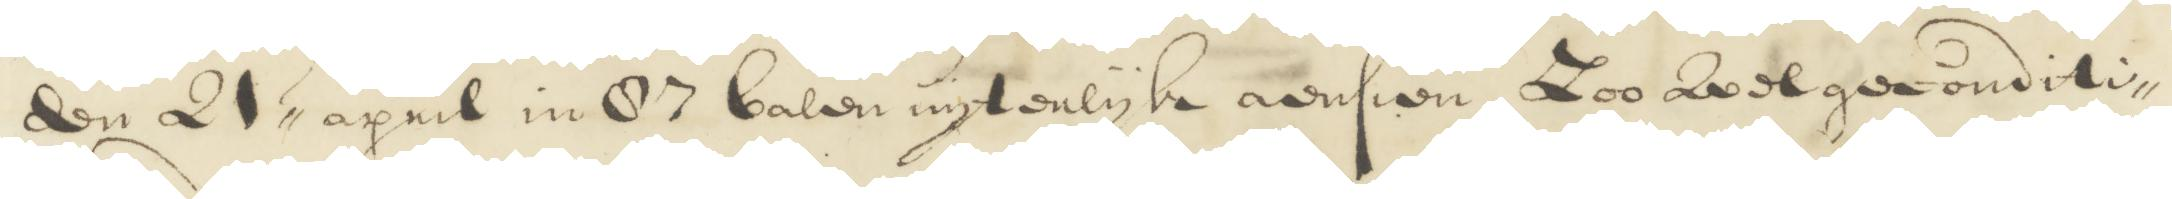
den 21„' april in 87 balen uijterlijk aensien, Zoo wel geconditi„
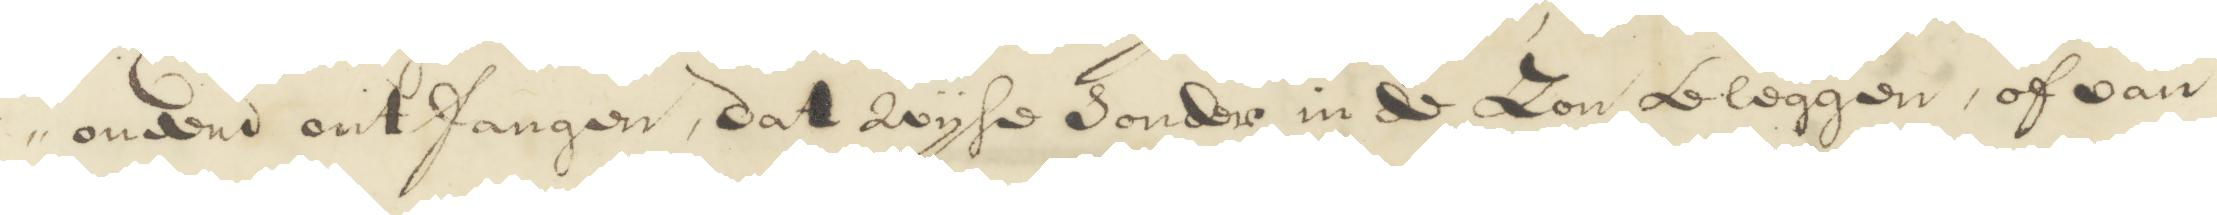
„oneerd ontfangen, dat wij se sonder in de Zon te leggen, of van
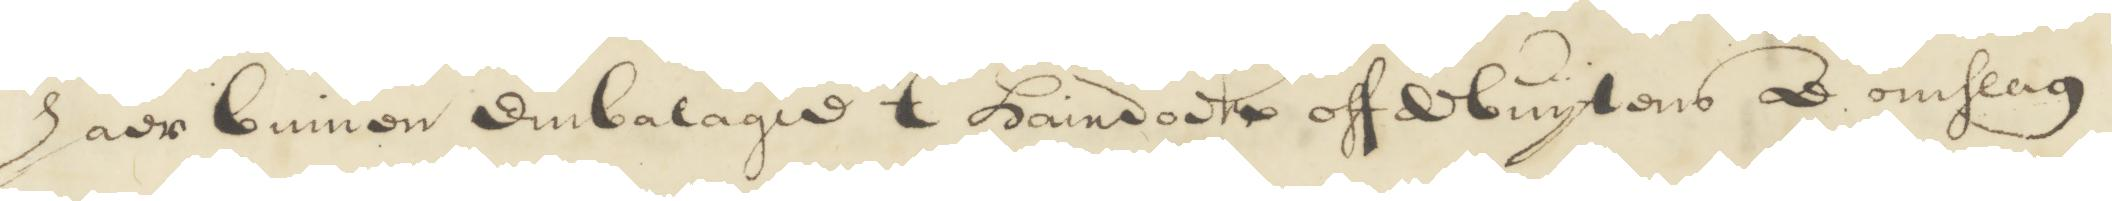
haer binnen Embalagie ’t hairdoek off de buijtenste omslag
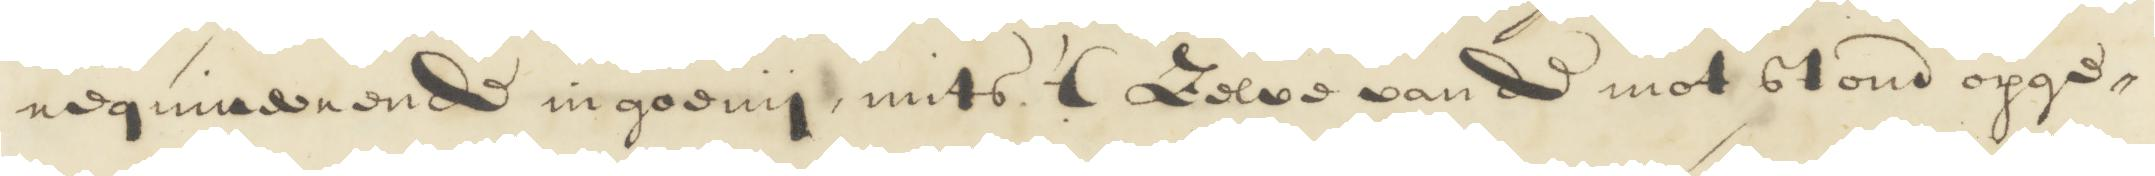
requineerende in goenij, mits ’t Zelve van de mot stond opge
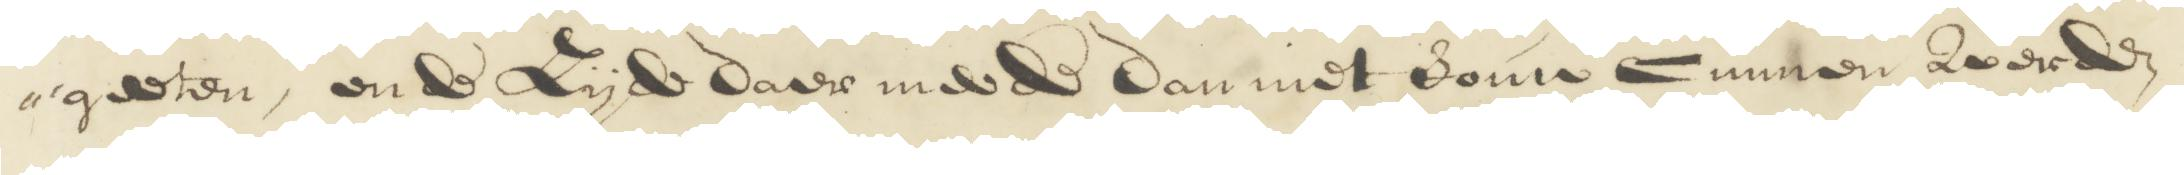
„geeten, en de Zijde daer meede dan niet souw Cunnen werden
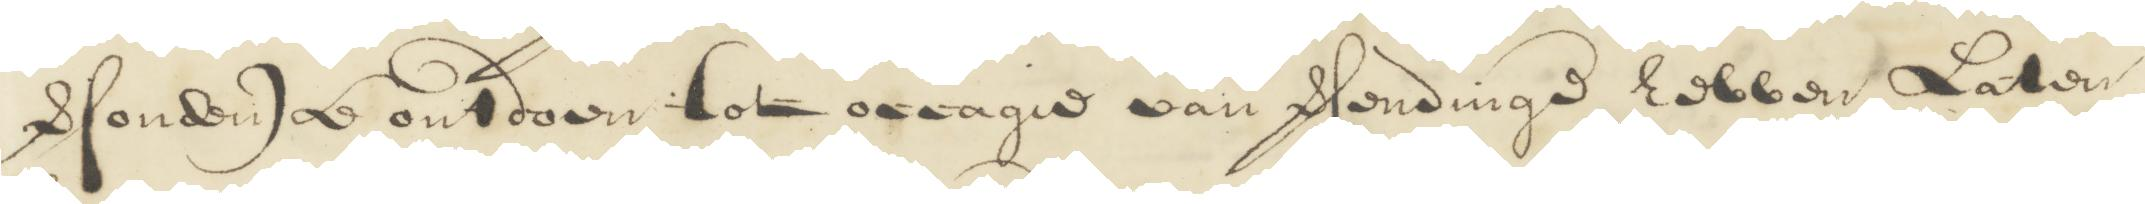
versonden) te ontdoen tot occagie van versendinge hebben Laten
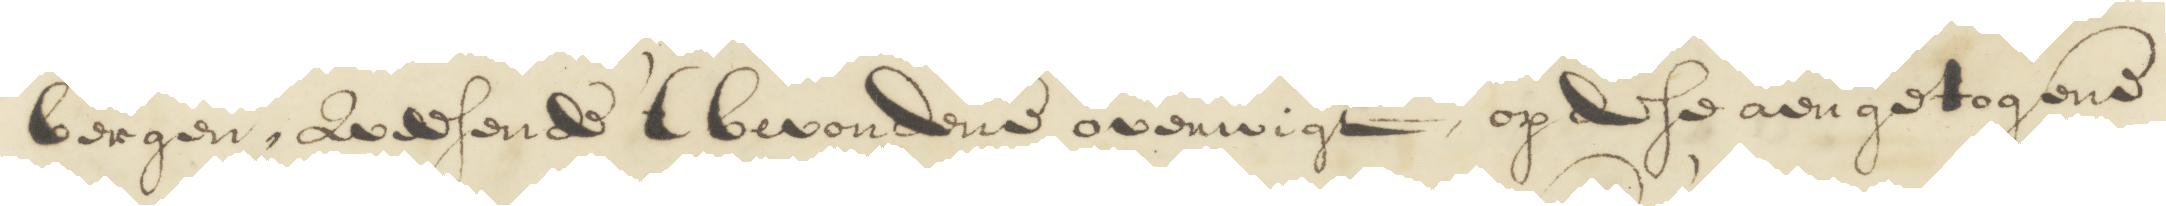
bergen, weesende ’t bevondene overwigt, op dese aengetogene
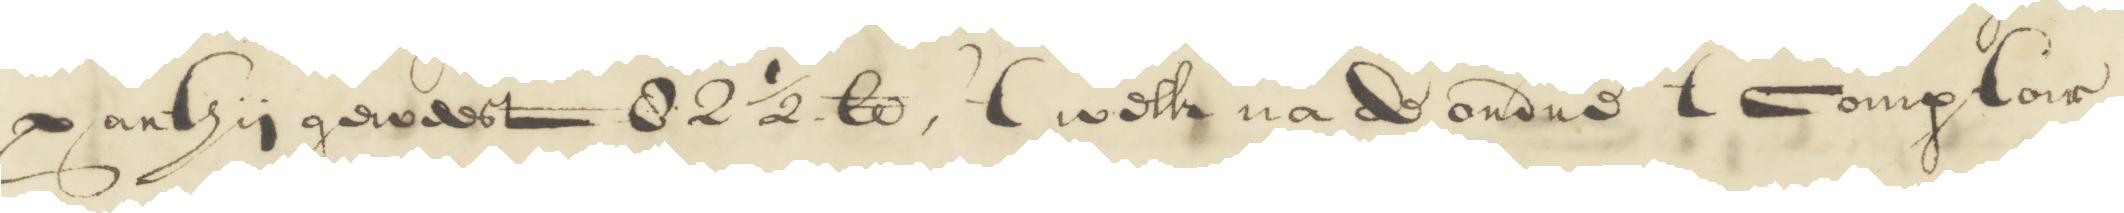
parthij geweest 82½ lb, ’t welk na de ordre ’t Comptoir
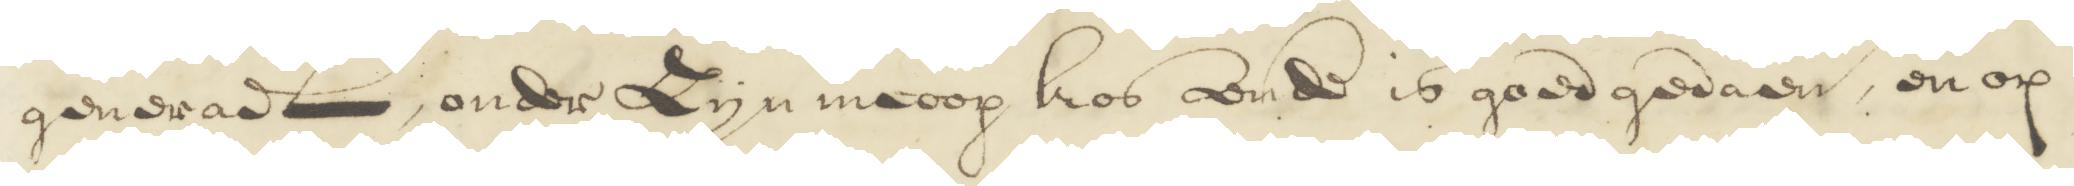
generael, onder Zijn incoop kostende is goed gedaen, en op
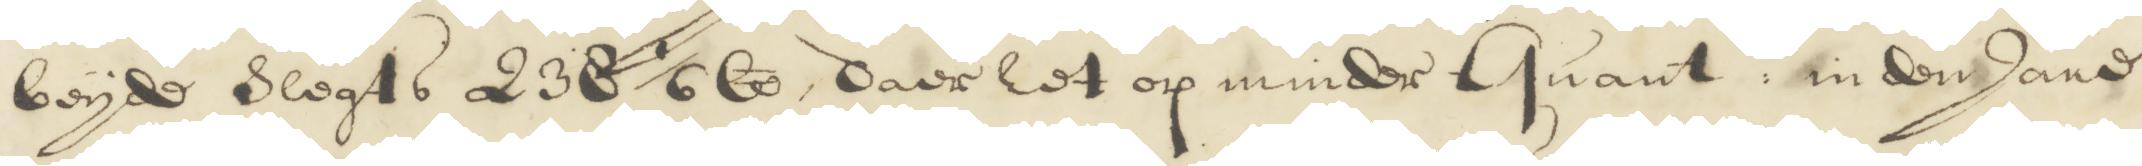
beijde slegts 238 1/6 lb, daer het op minder Quant:t in den Jare
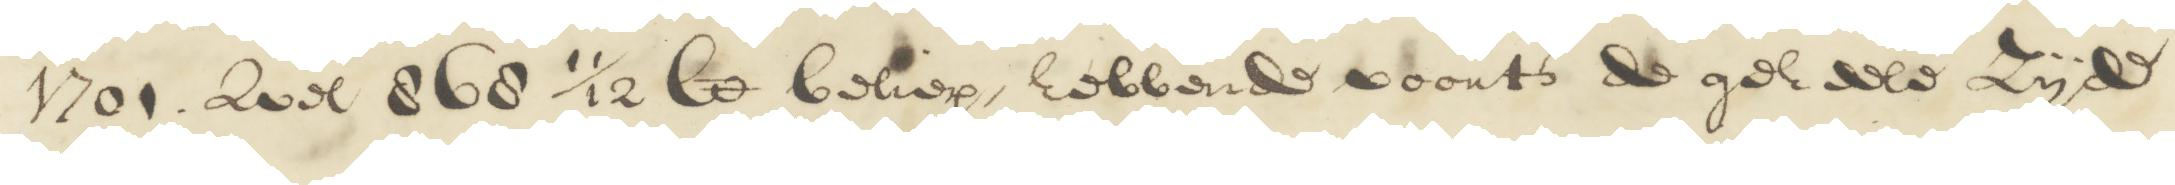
1701. wel 868 11/12 lb beliep, hebbende voorts de geheele Zijde
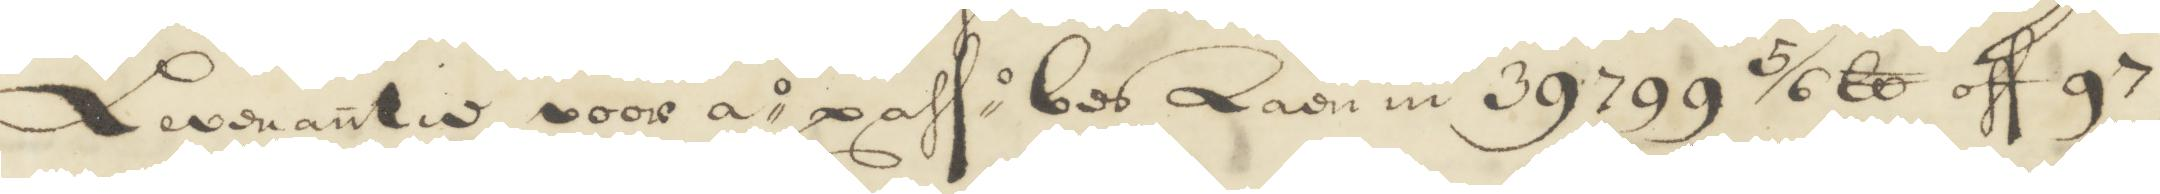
Leverantie voor a„o pass„o bestaen in 39799 5/6 lb off 97
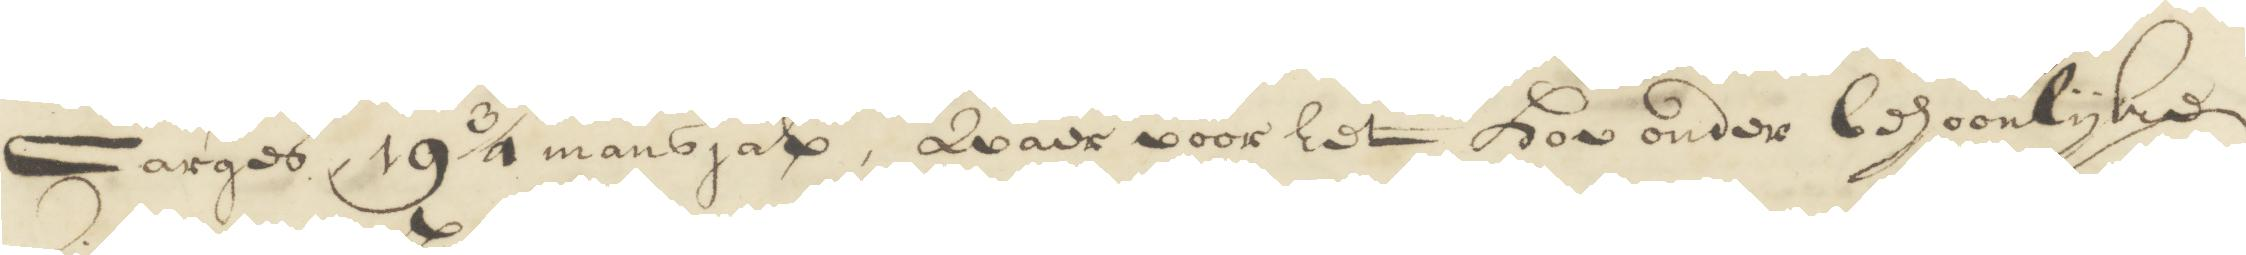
Carges 19¾ mansjab, waer voor het hov onder behoorlijke
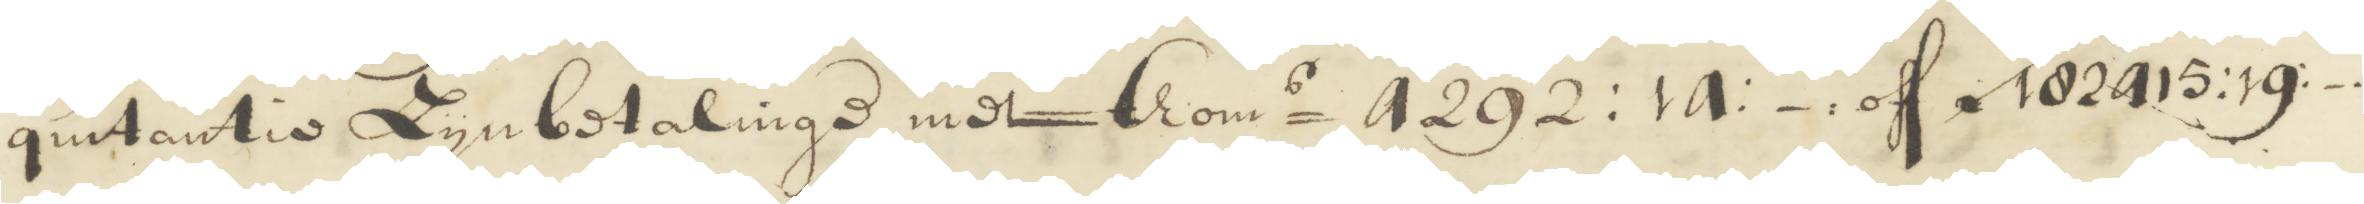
quitantie Zijn betalinge met thom=s 4292: 14:–. off ƒ182415:19:-.
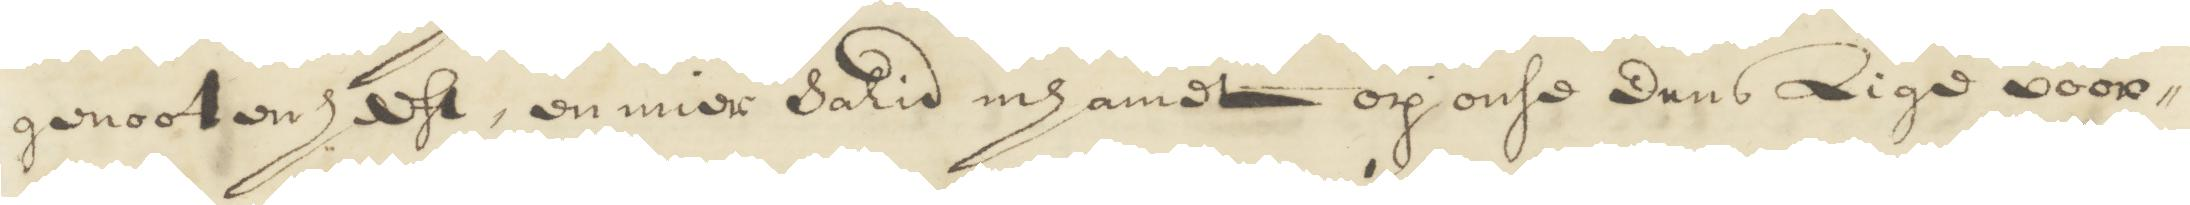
genooten heeft, en mier Sahid inhamet op onse Ernstige voor„
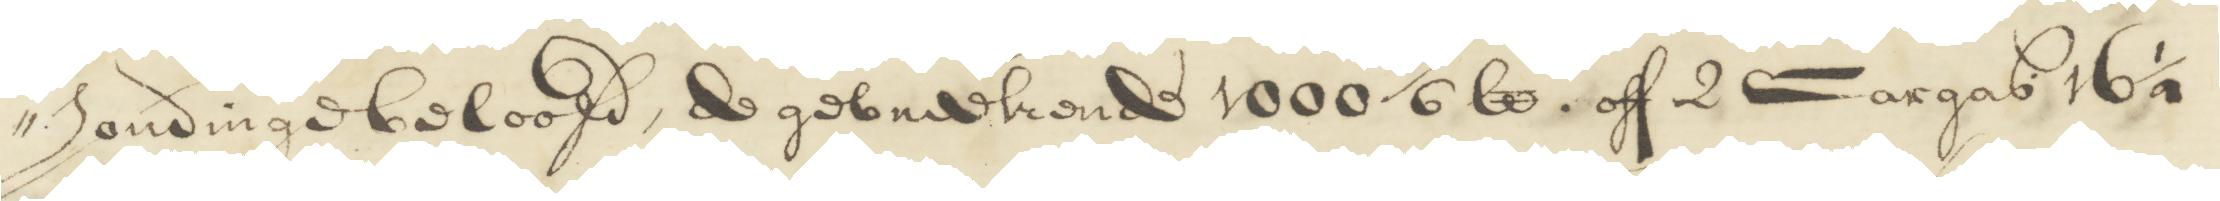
„houdinge beloofd, de gebreekende 1000 1/6 lb. off 2 Cargas 16¼
